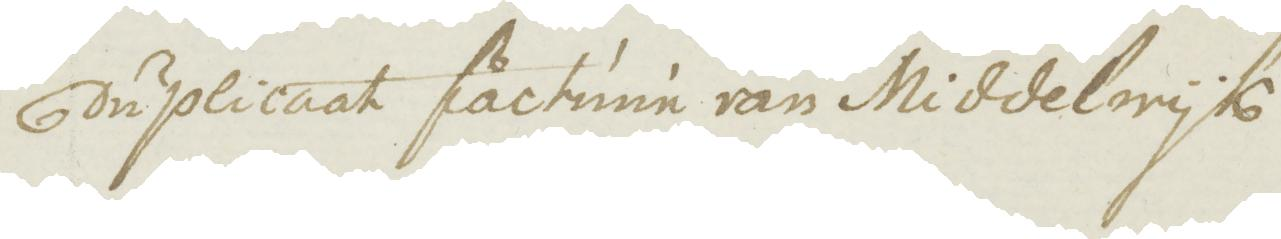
duplicaat factuur van Middelwijk
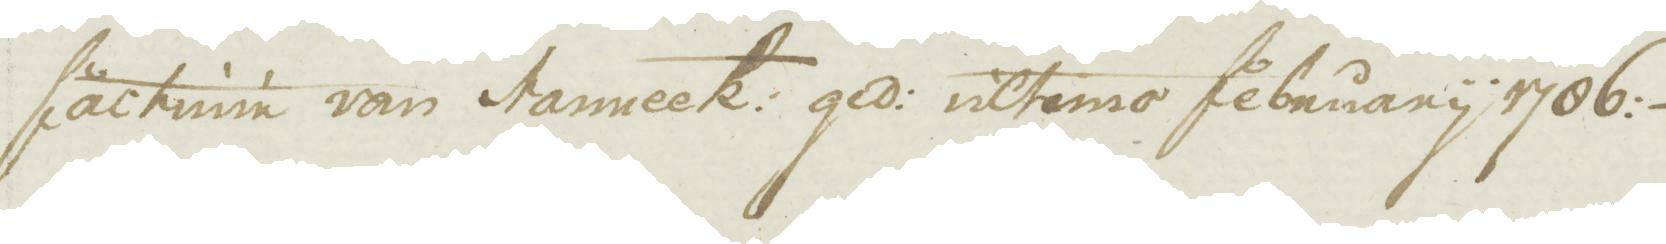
factuur van Nanreek: ged: ultimo februarij 1786:-.
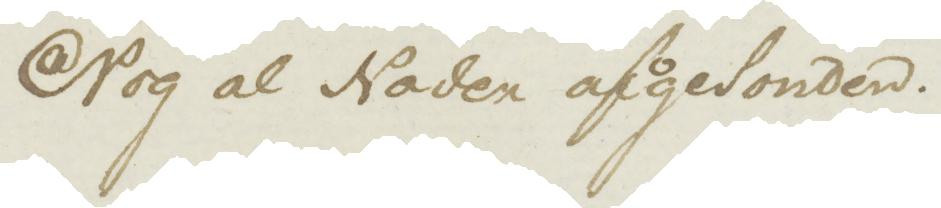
Nog al Nader afgesonden.
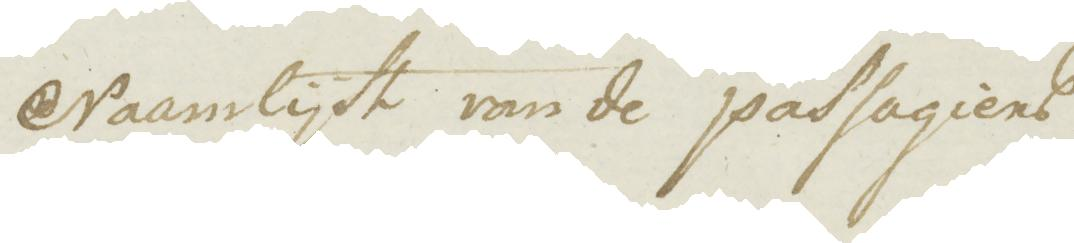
Naamlijst van de passagiers
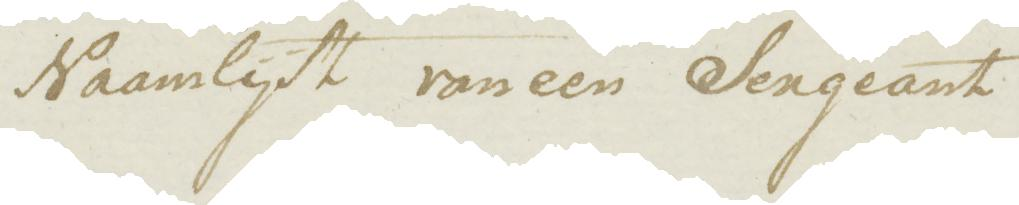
Naamlijst van een Sergeant
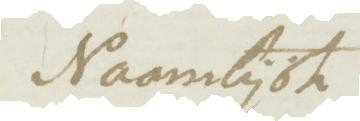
Naamlijst
